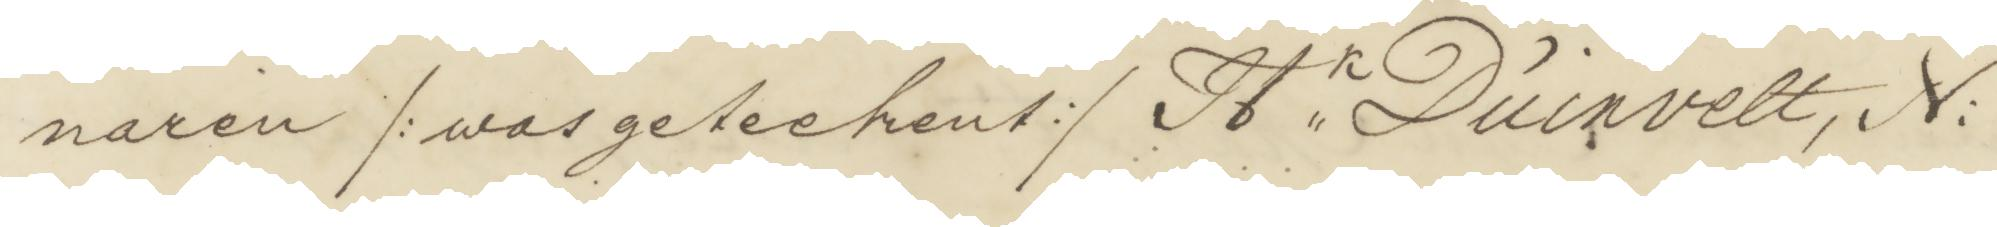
naren /:was geteekent:/ H„k Duinvelt, N:
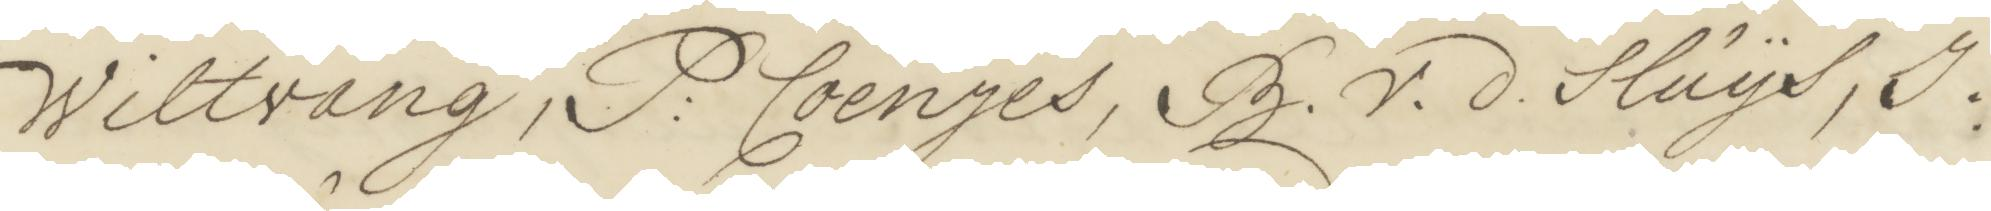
Wiltvang, P: Coenjes, B. v. d. sluijs, I:
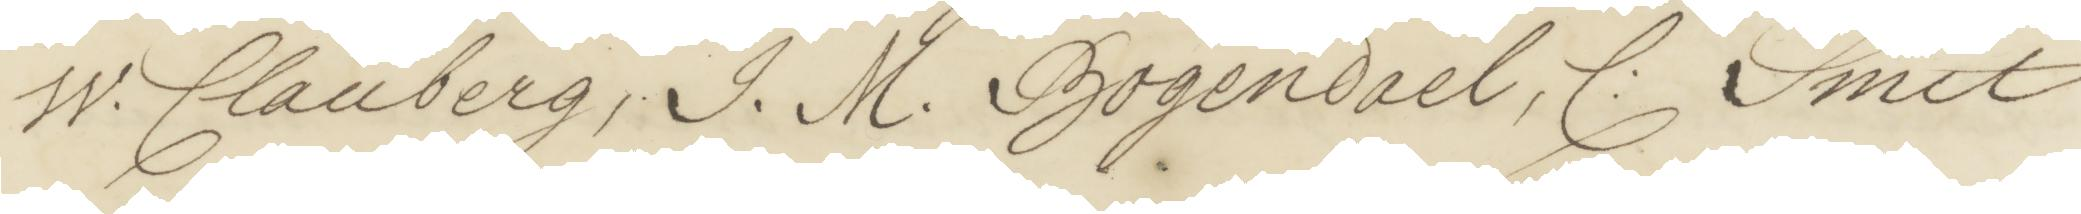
W. Clauberg, I. M. Bogendael, C: smit
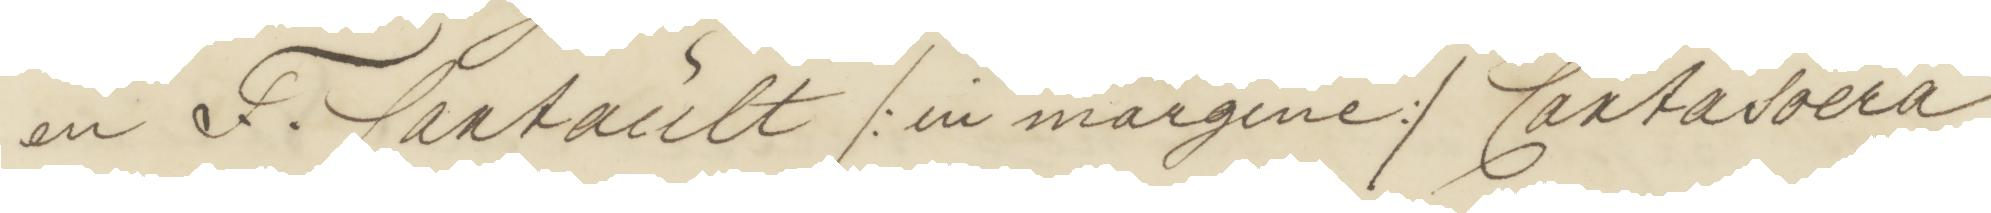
en F. Cartault /:in margine:/ Cartasoera
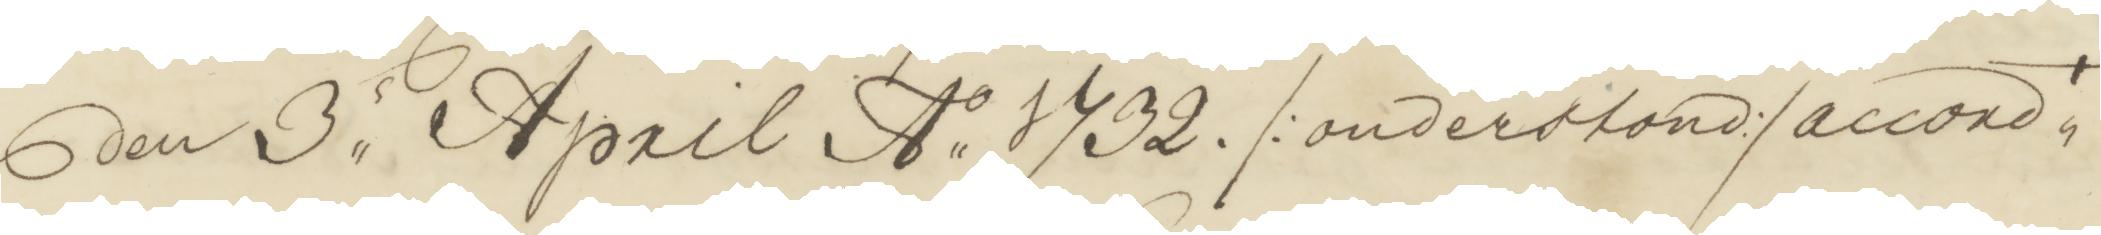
den 3„' April A„o 1732. /:onderstond:/ accord„t
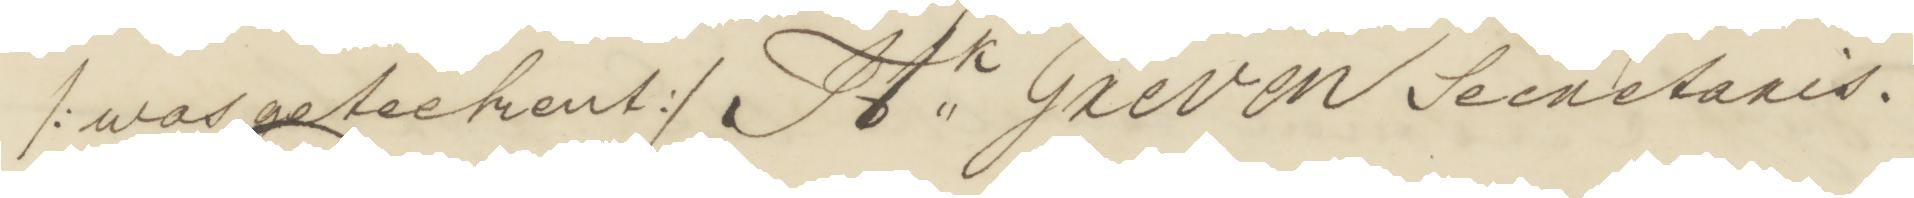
/:was geteekent:/ H„k Greven secretaris.
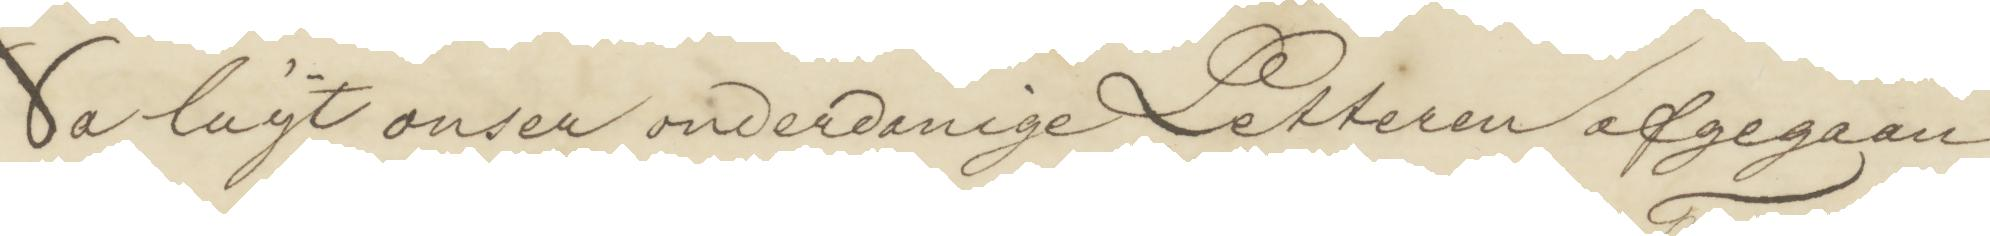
Na luijt onser onderdanige Letteren afgegaan
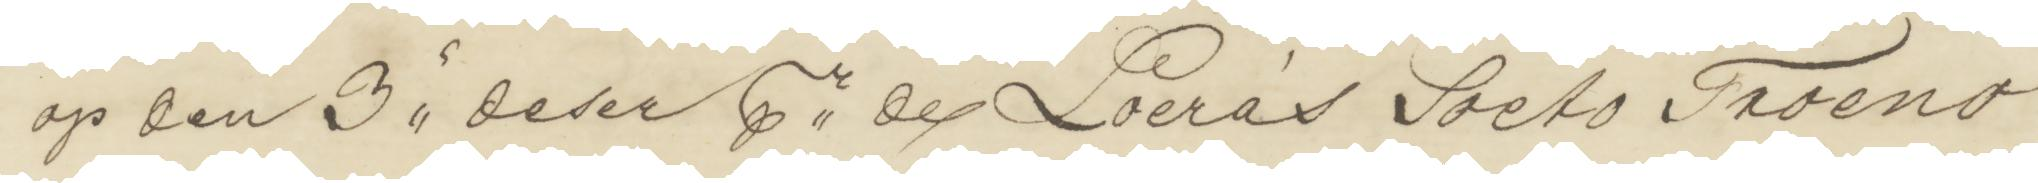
op den 3„' deser p„r de Loera's soeto Troeno
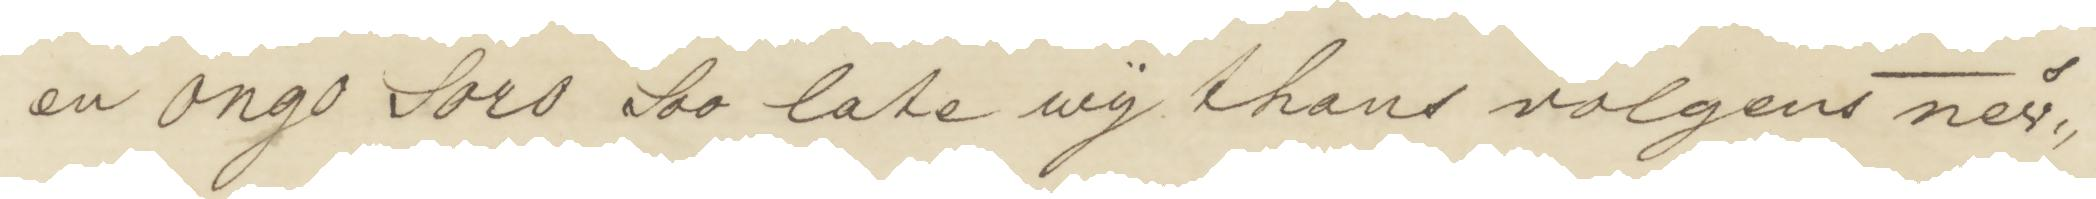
en ongo soro soo late wij thans volgens nev„s
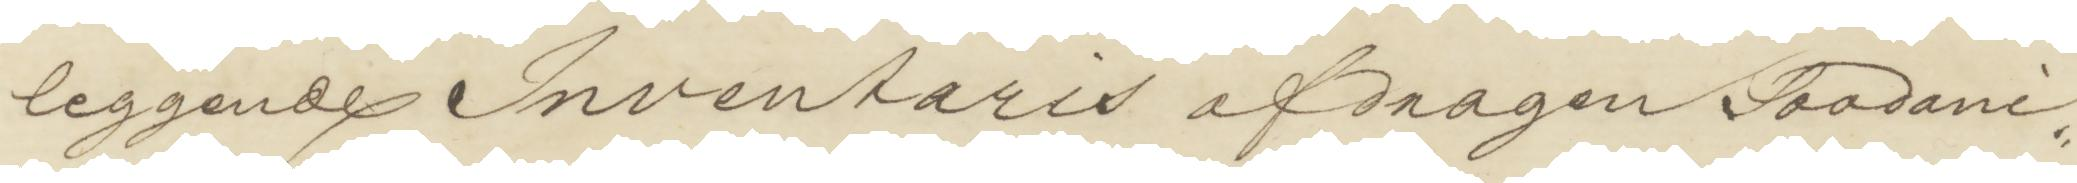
leggende Inventaris afdragen soodani„
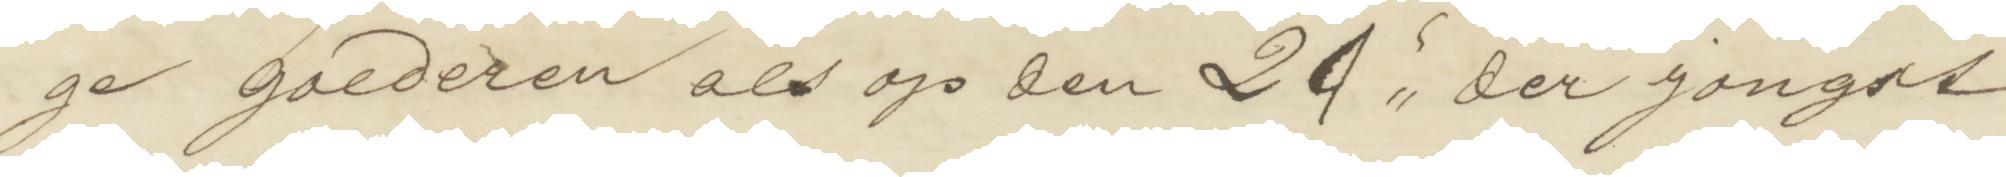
ge goederen als op den 24„' der jongst
